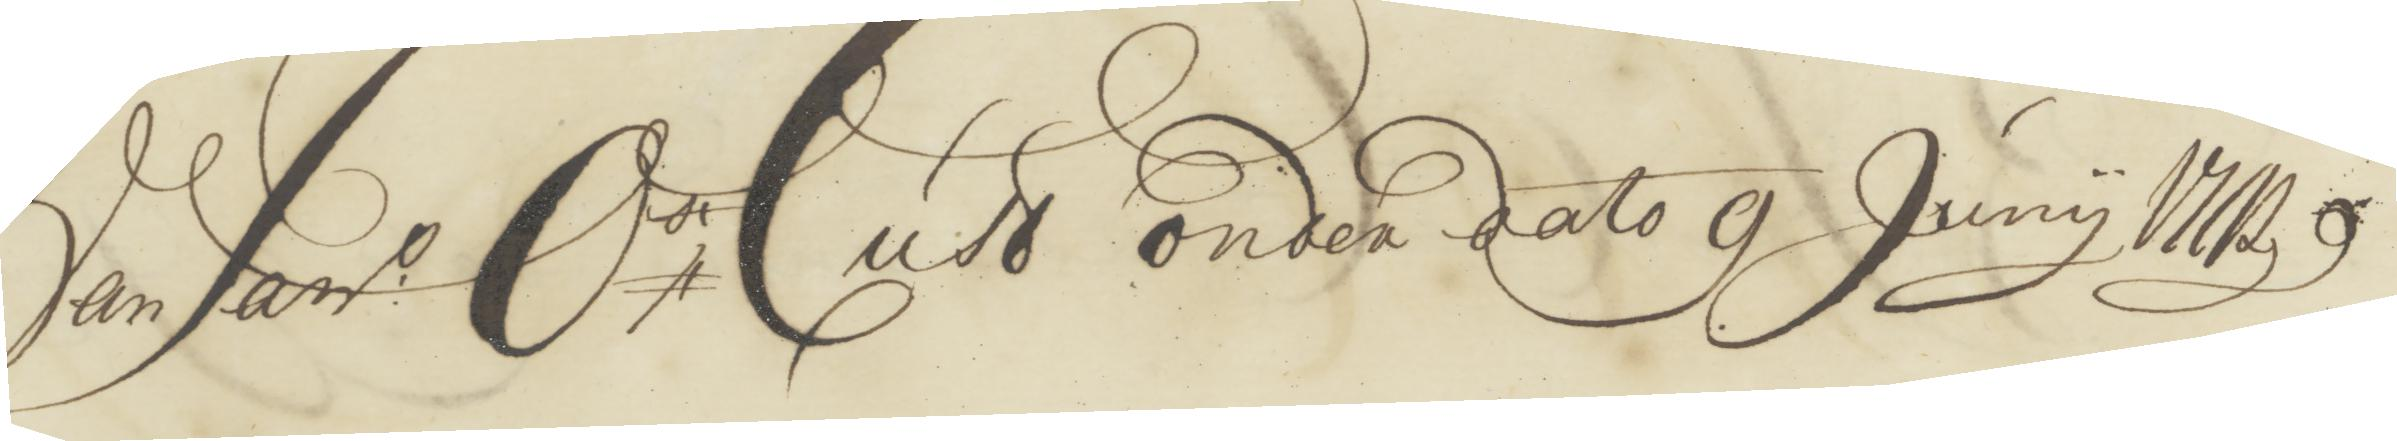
Van Jav:s O#st Cust onder dato 9 Junij 1742 9
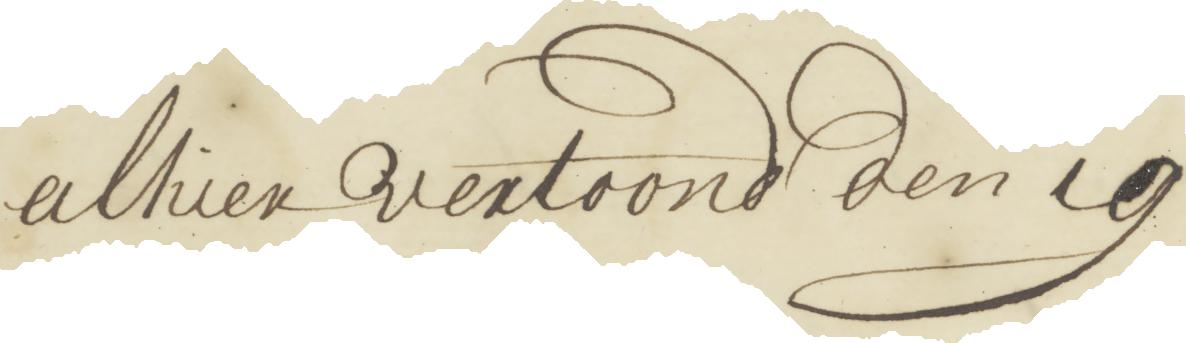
alhier vertoond den 19
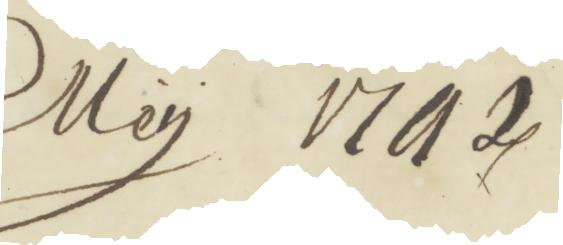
Meij 1742
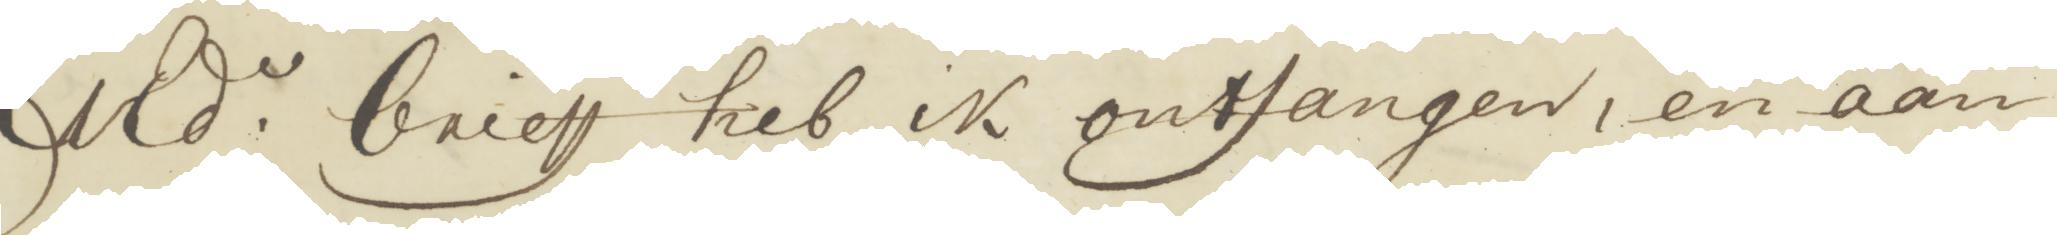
UEd: brieff heb ik ontfangen, en aan
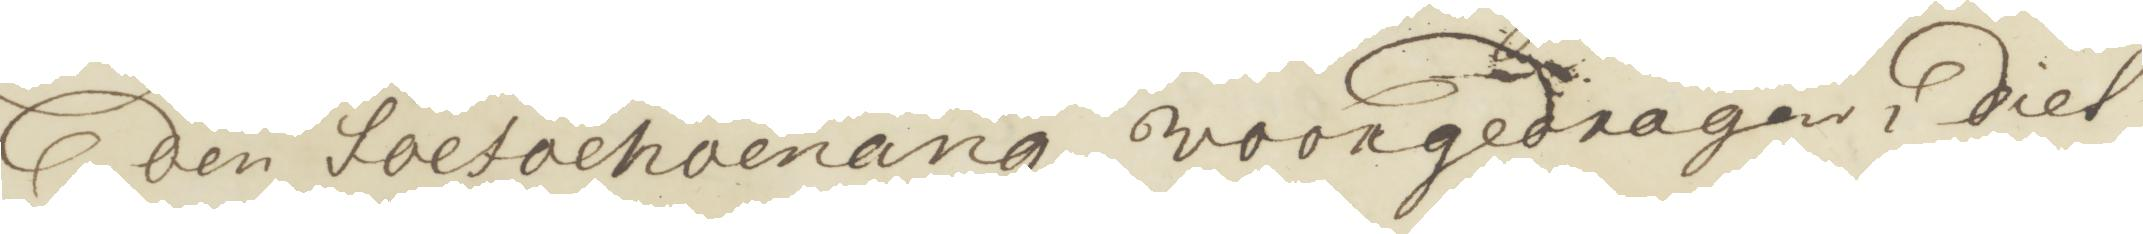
den soesoehoenang voorgedragen, dies
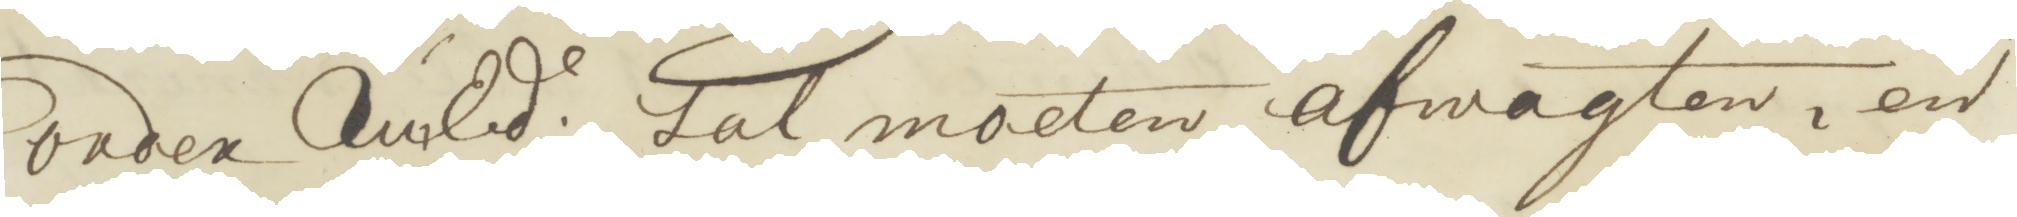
order UwEd:e sal moeten afwagten, en
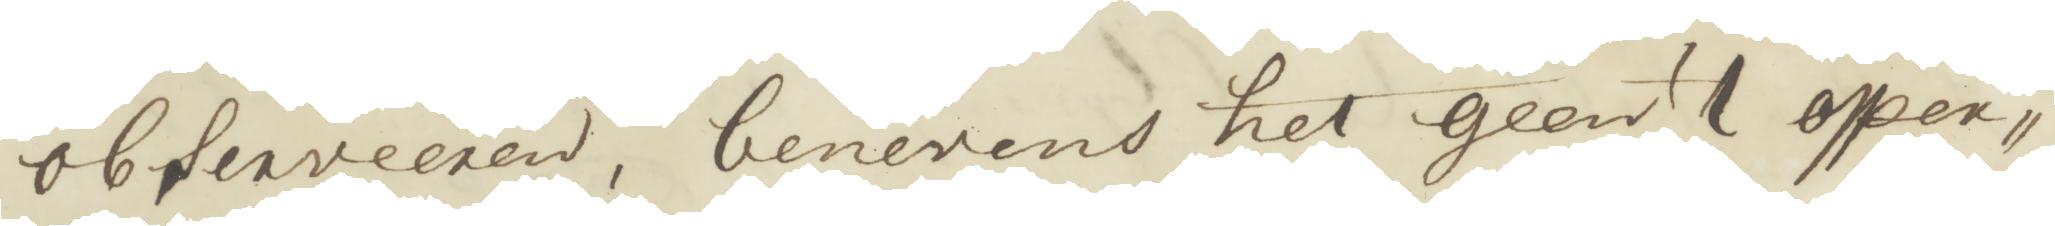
observeeren, benevens het geen 't opper„
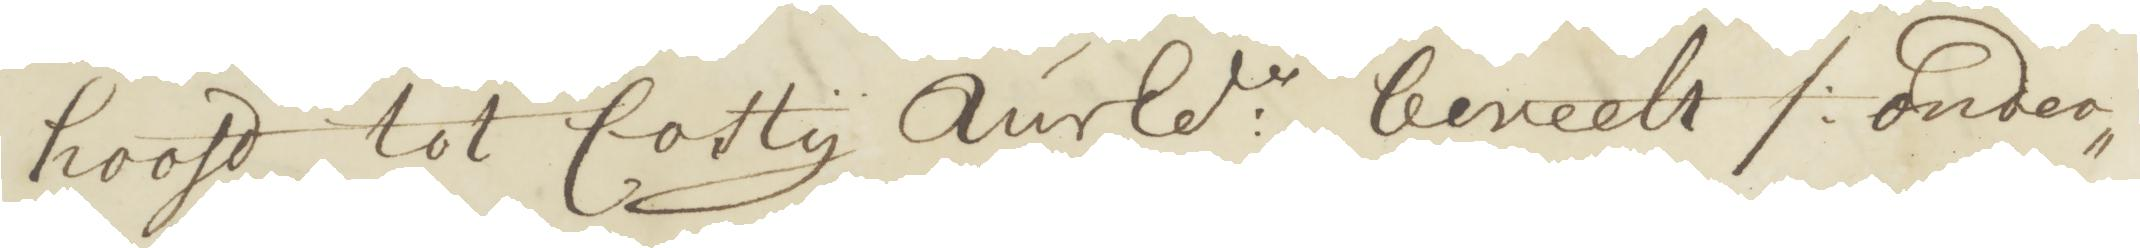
hoofd tot Costij uwEd:e beveelt /:onder„
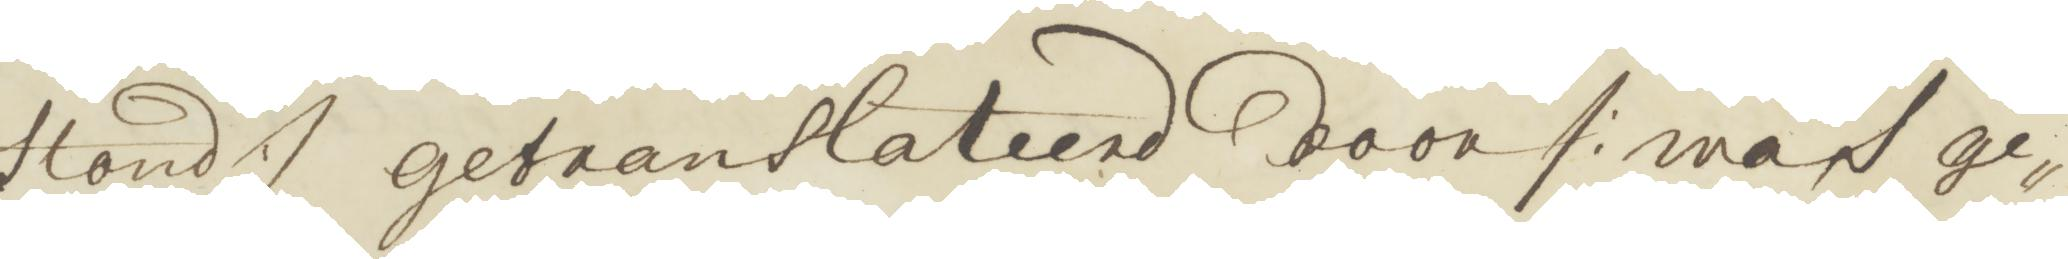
stond:/ getranslateerd door /:was ge„
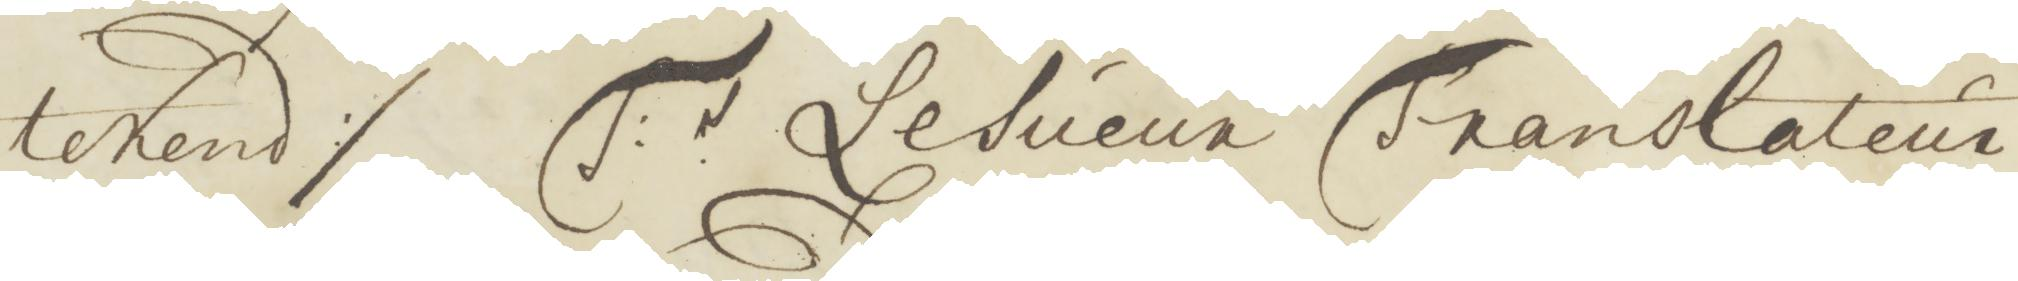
tekend:/ T:s Lesueur Translateur
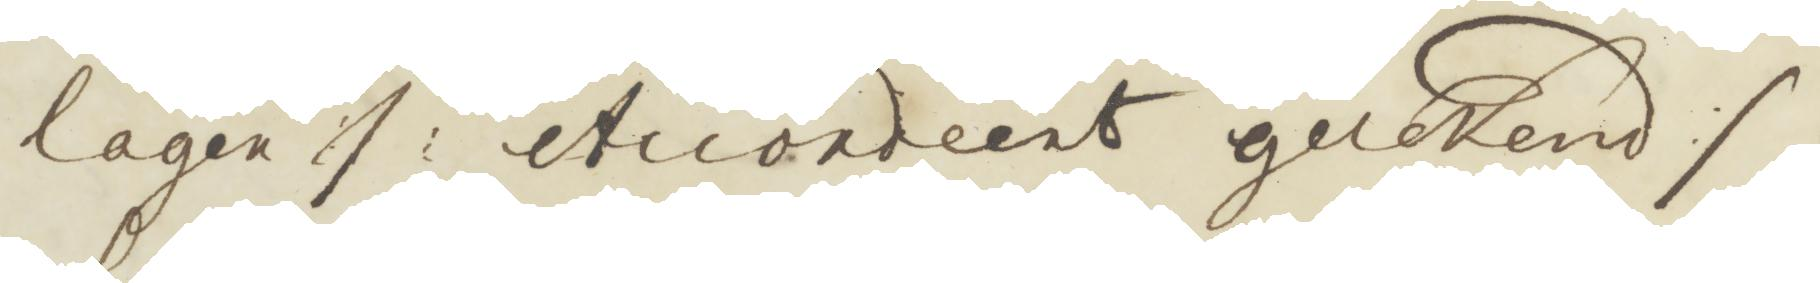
lager :/:Accordeert getekend :/ P.
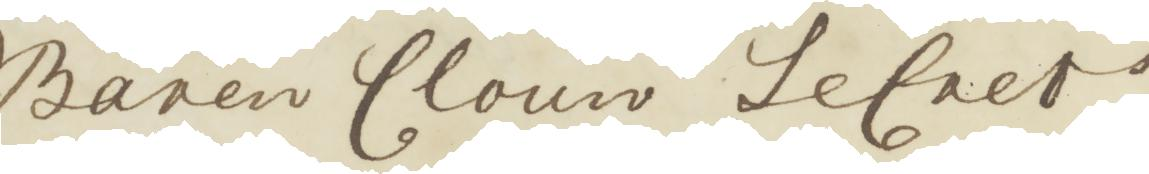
L Baren Clouw secrets
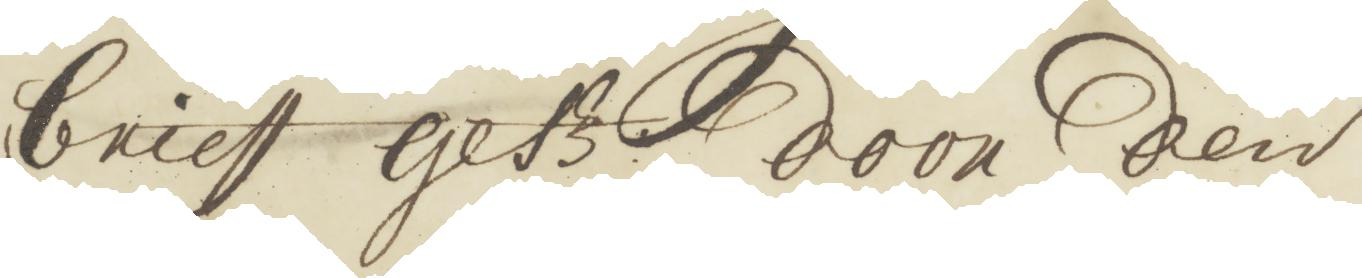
brieff gesz: door den
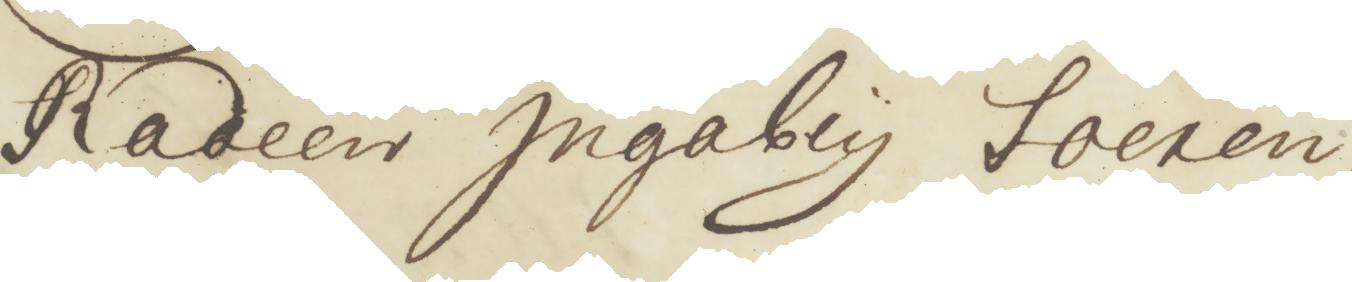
Radeen Jngabeij soeren
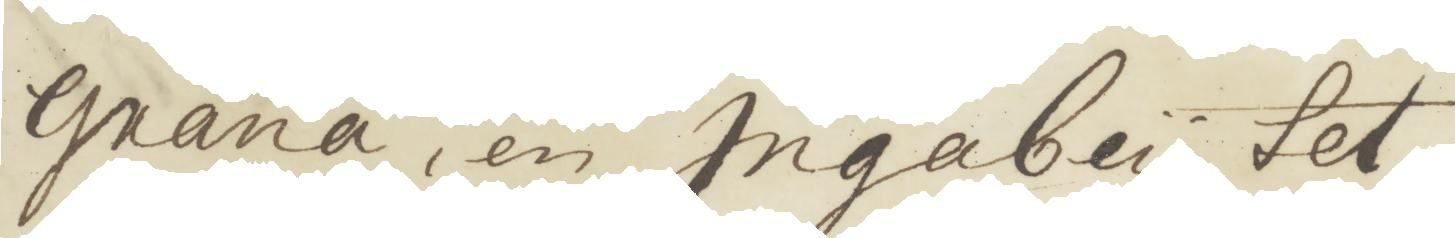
grana, en Jngabeij set,
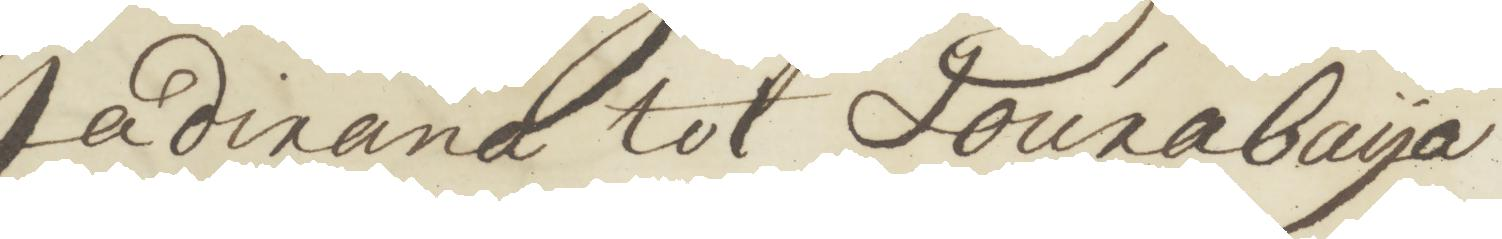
Jadirana tot sourabaija
